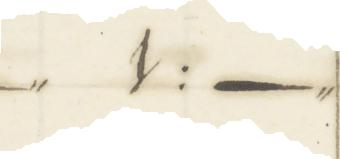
— „1: —„
